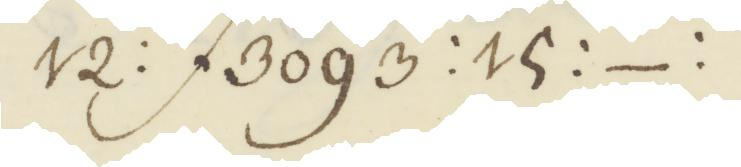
12: ƒ3093:15:—:
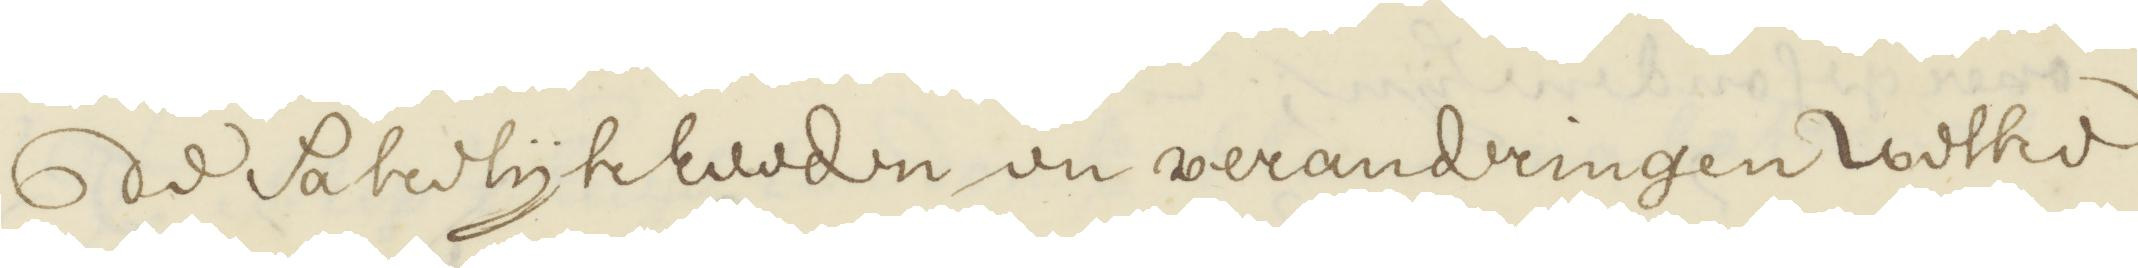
de sakelijkheeden en veranderingen welke
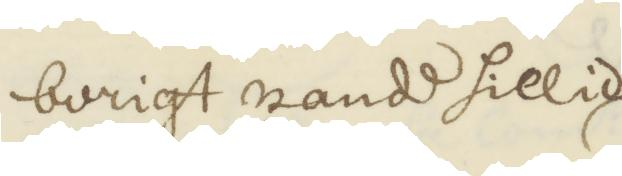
berigt van de sillidase
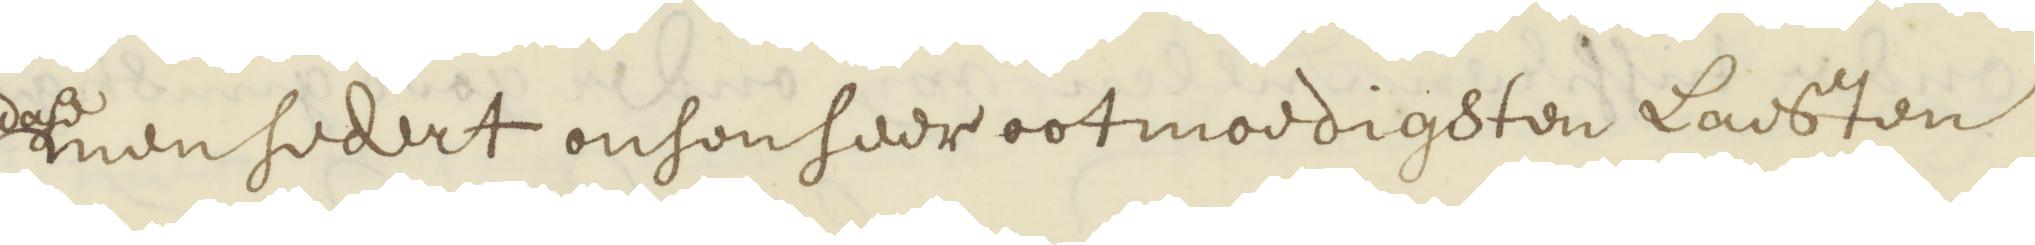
men sedert onsen seer ootmoedigsten laesten
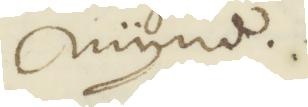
mijne.
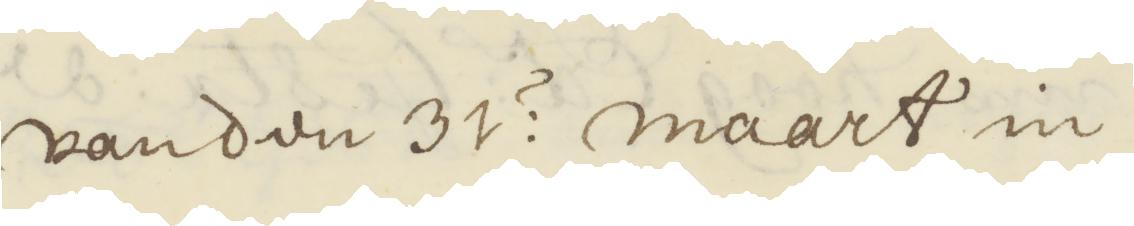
van den 31:' maart in
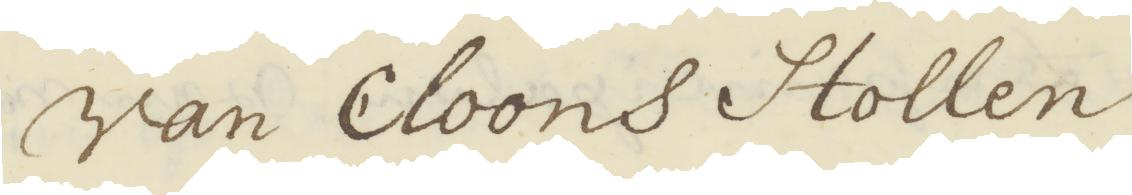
van Cloons stollen
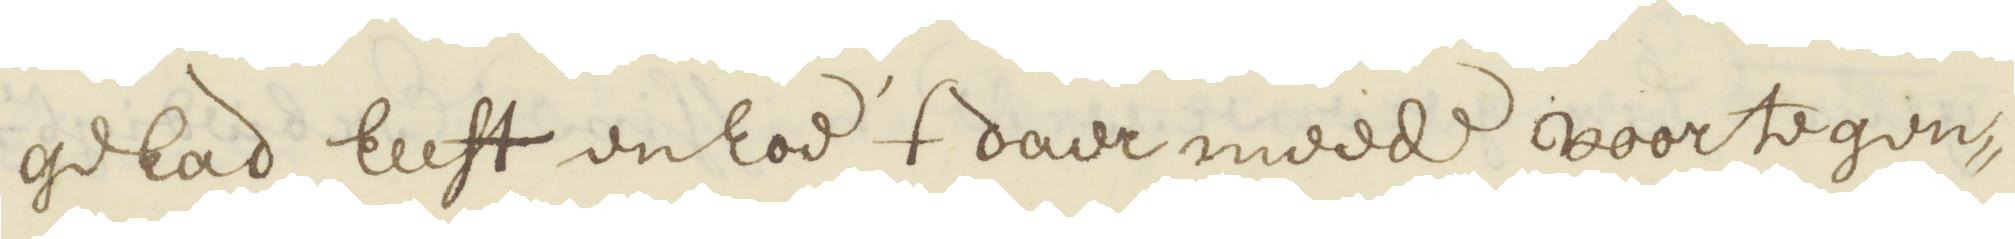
gehad heeft en hoe ’t daer meede voor tegen„
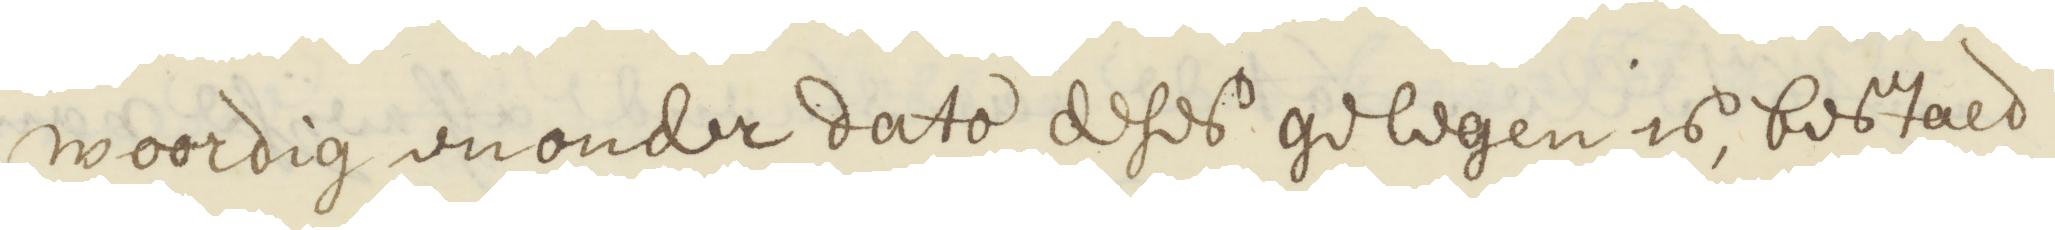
woordig en onder dato deses gelegen is, bestaed
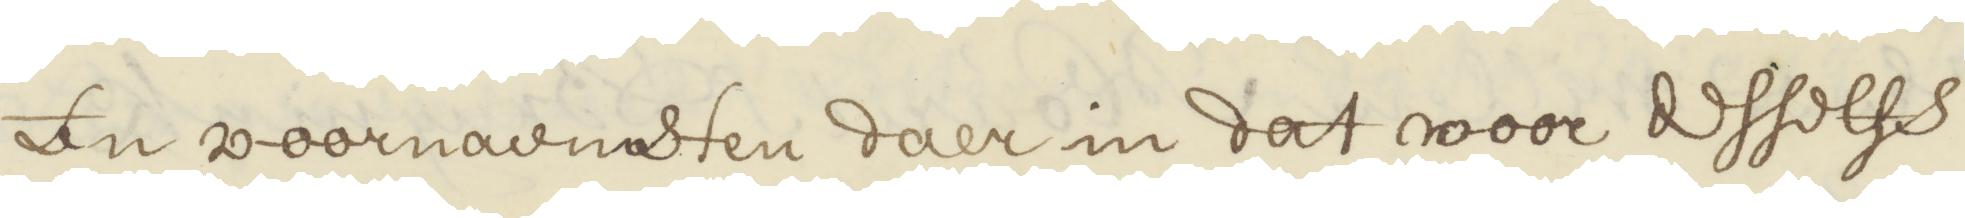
ten voornaemsten daer in dat voor desselfs
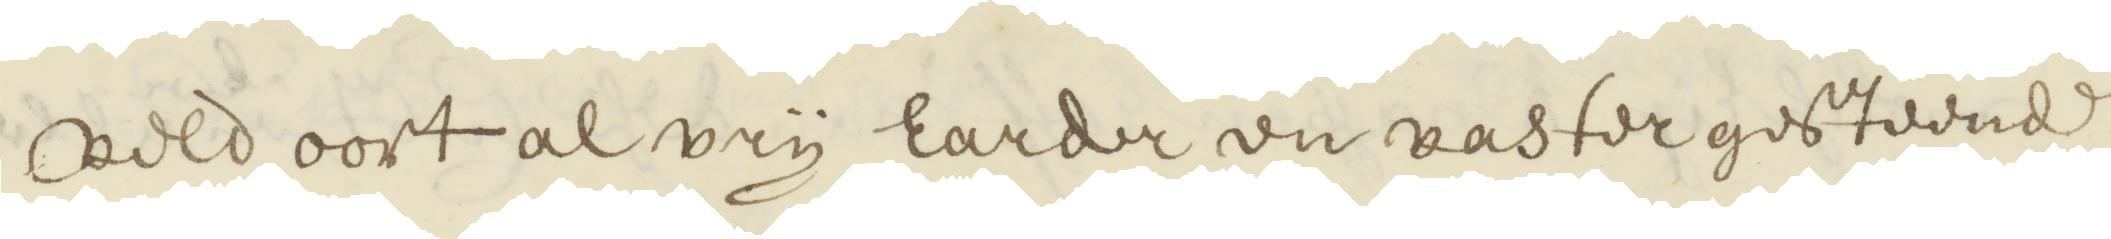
veld oort al vrij harder en vaster gesteende
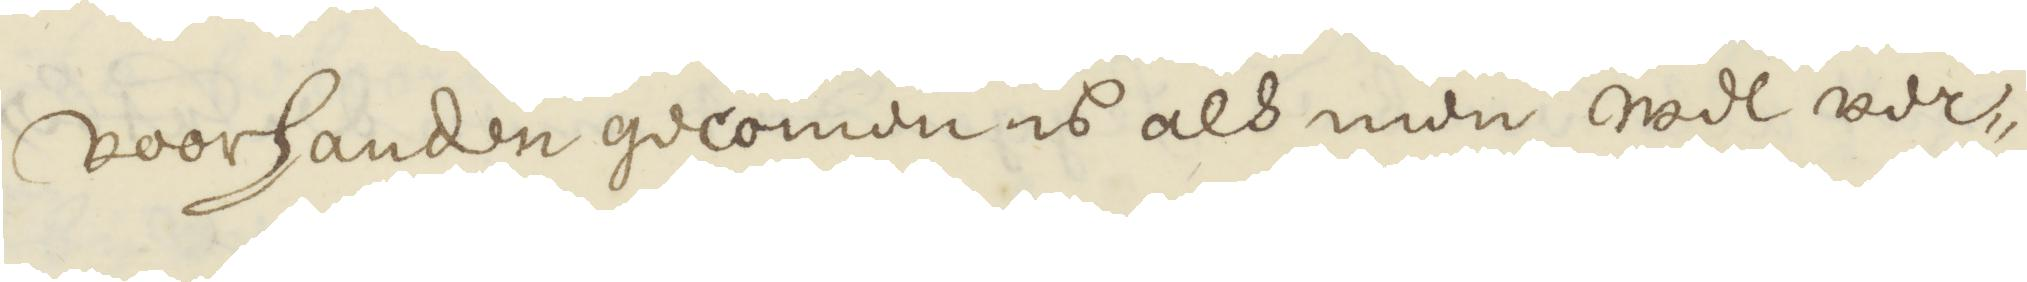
voorhanden gecomen is als men wel ver„
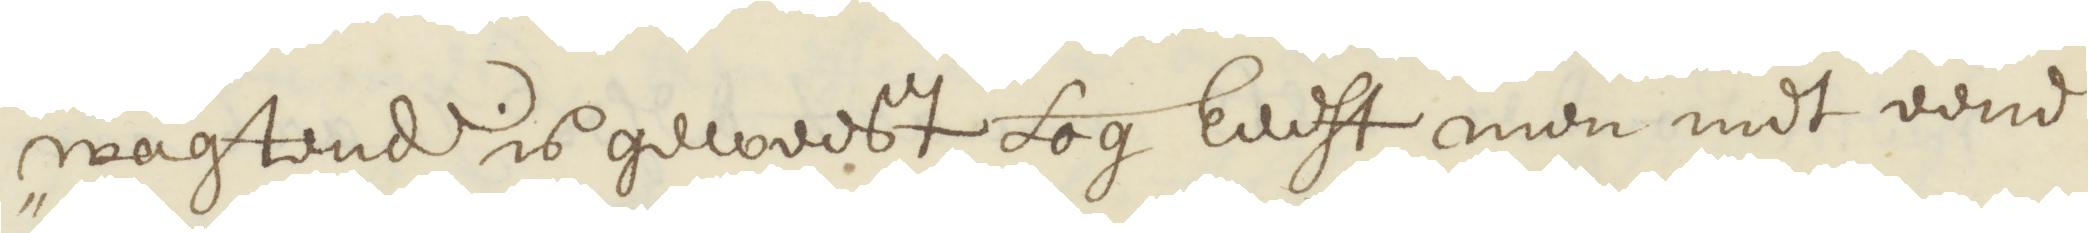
„wagtende is geweest, tog heeft men met eene
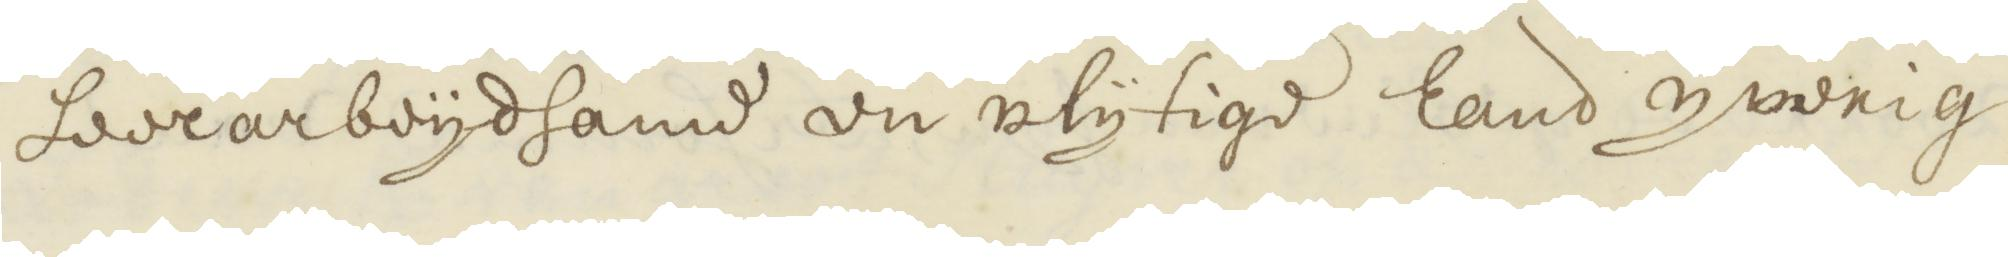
seer arbeijdsame en vlijtige hand ijverig
